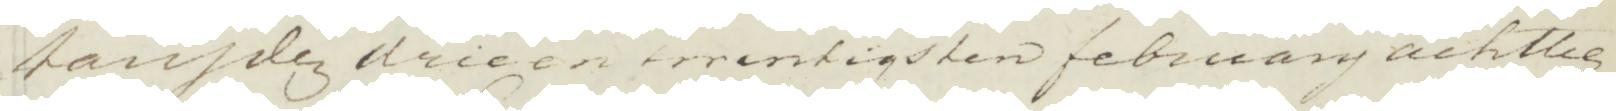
taris den drie en twintigsten february achttien
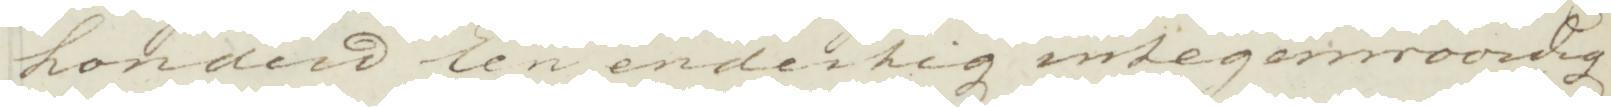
honderd Een endertig in tegenwoordig
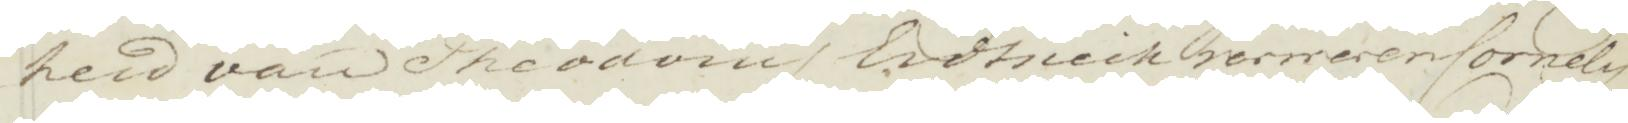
heid van Theodorus Erdtsieck verwer en Corneli
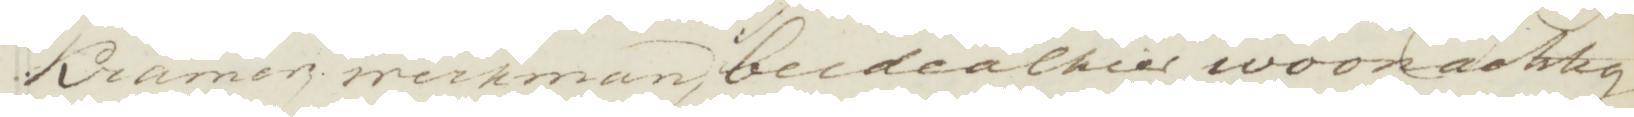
Kramer, werkman, beide alhier woonachtig
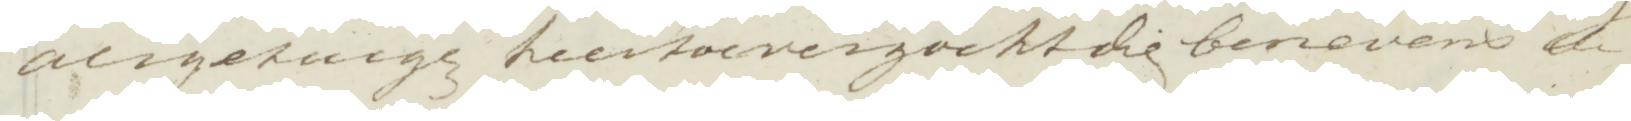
als getuigen hiertoe verzocht die benevens de
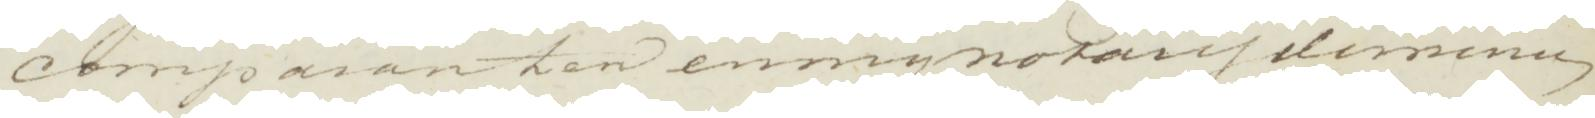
comparanten en my notaris deminu
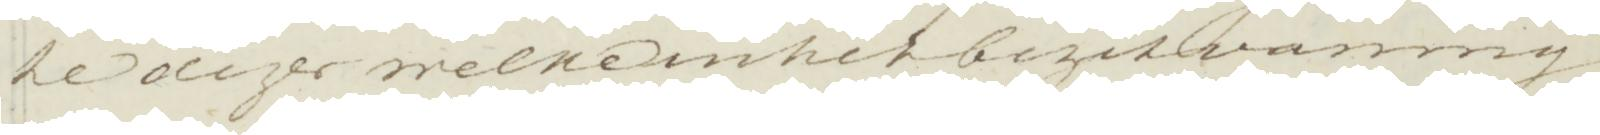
te dezer welke in het bezit van my
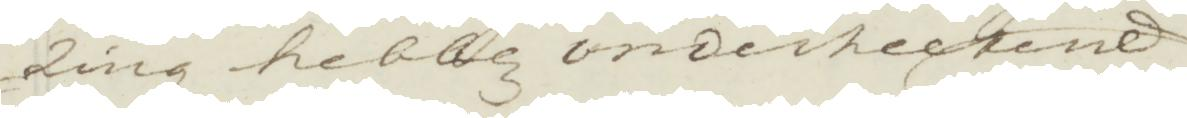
=zing hebben onderteekend
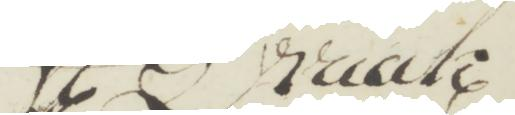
K Draak
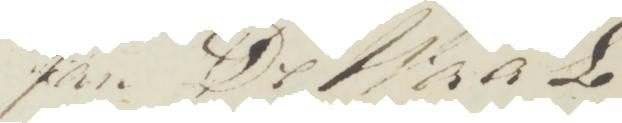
Jan De Waal
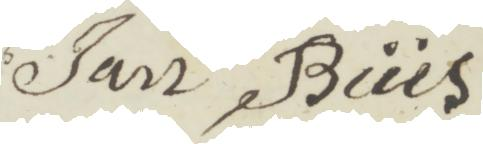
Jan Buis
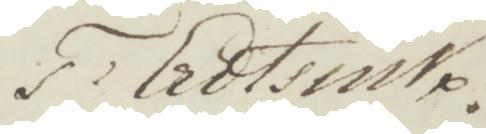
T: Erdtsieck.
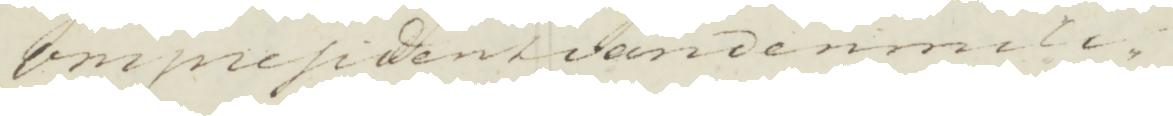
ons president van den mili„
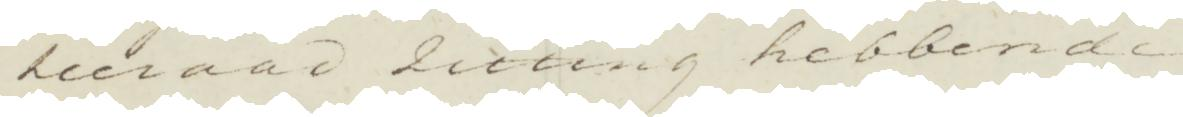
tieraad zitting hebbende
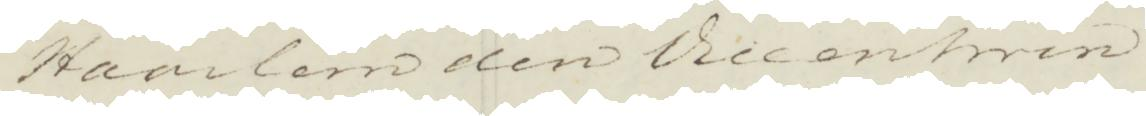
Haarlem den drie entwin
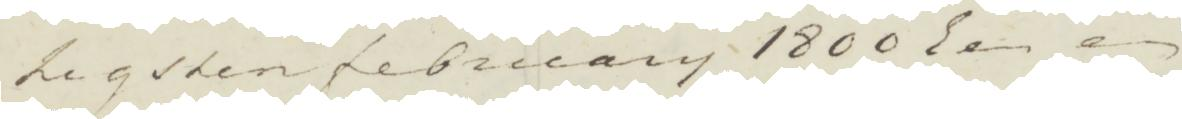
tigsten february 1800 Een en
